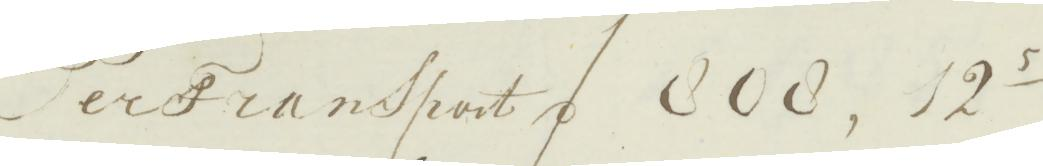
Per Transport ƒ 808, 12 /5
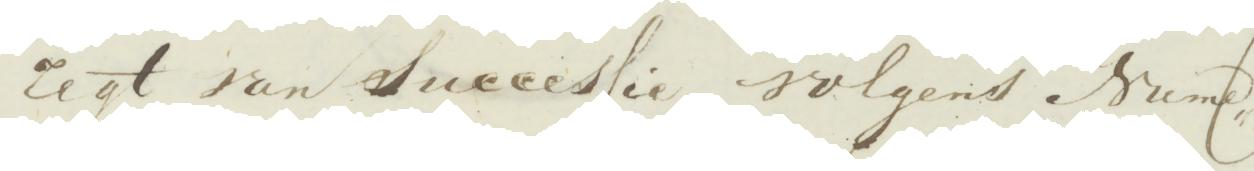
regt van Successie, volgens Nume„
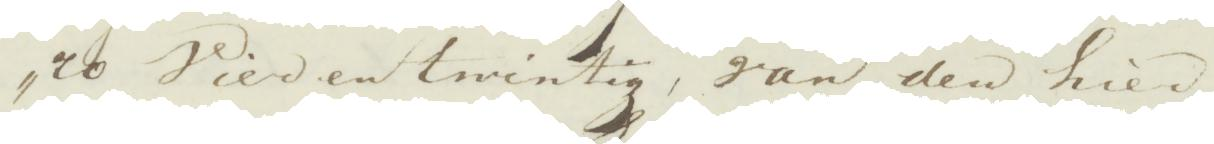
„ro Vier en twintig, van den hier
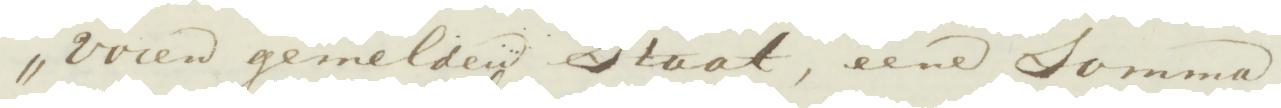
„voren gemelden Staat, eene Somma
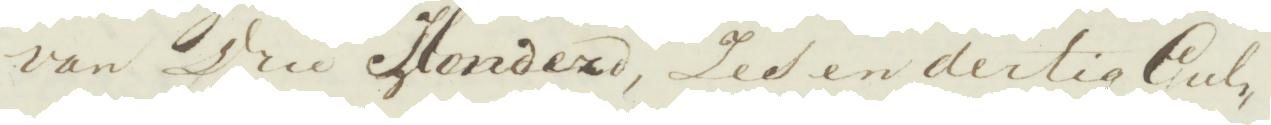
van Drie Honderd, Zes en dertig Gul„
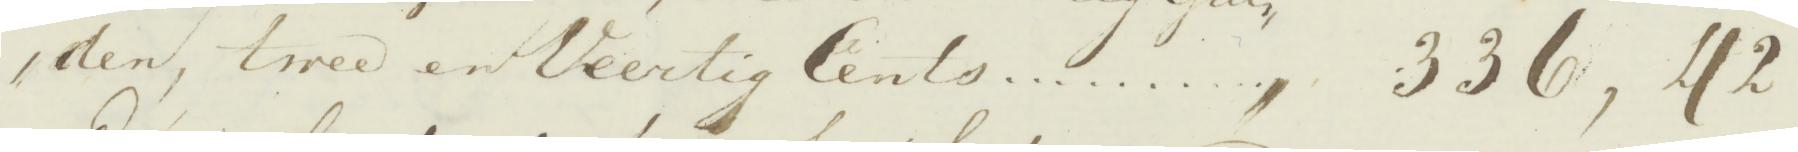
„den, twee en Veertig Cents . . . . . . . . . . „ 336, 42
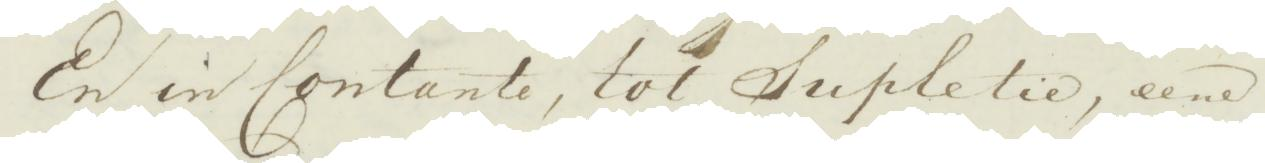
En in Contante, tot Supletie, eene
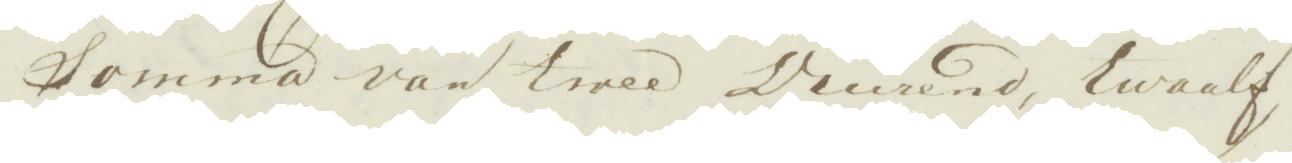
somma van twee Duizend, twaalf
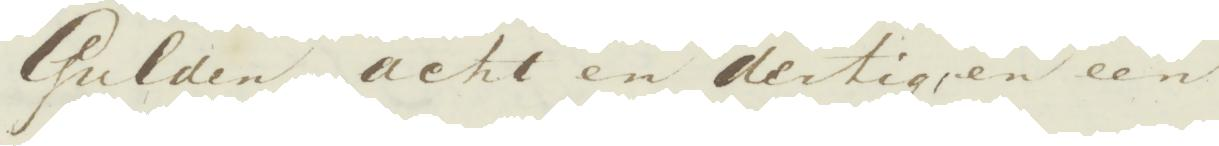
Gulden, acht en dertig, en een
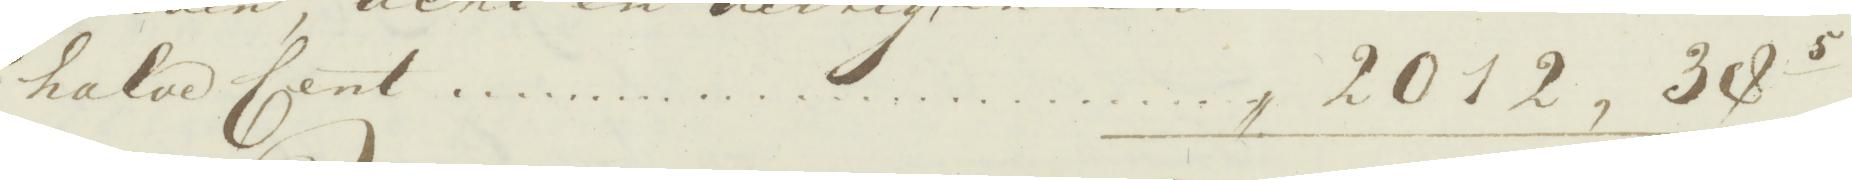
halve Cent . . . . . . . . . . . . . . . . . . . . . . . . . „ 2012, 38 /5
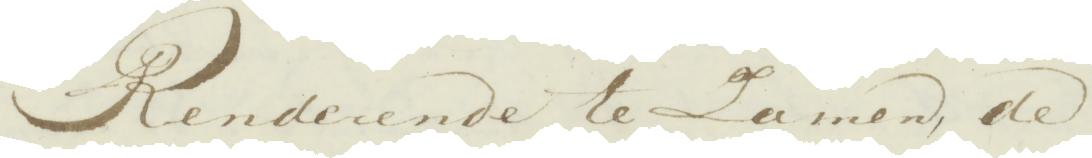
Renderende te Zamen, de
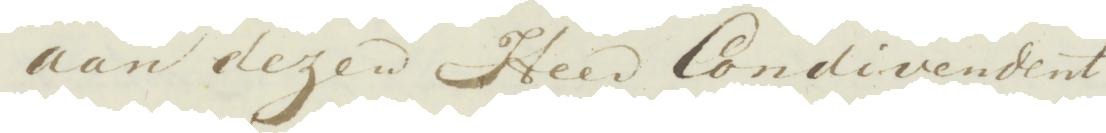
aan dezen Heer Condivendent
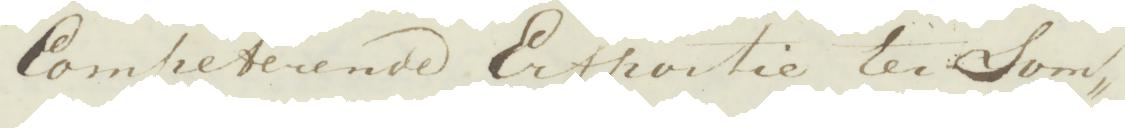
Competerende Erfportie ter Som„
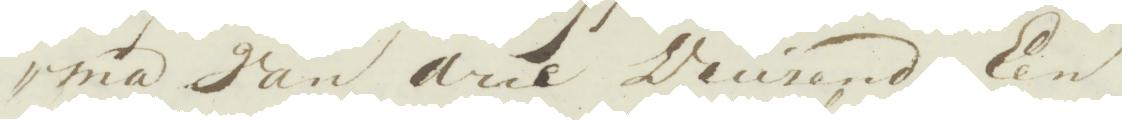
„ma van drie Duizend, Een
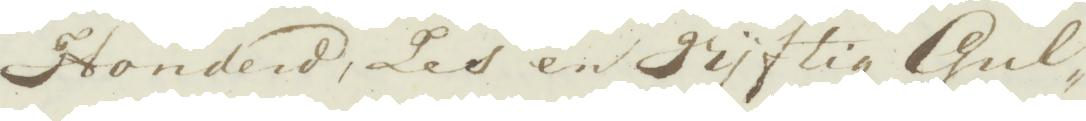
Honderd, Zes en Vijftig Gul„
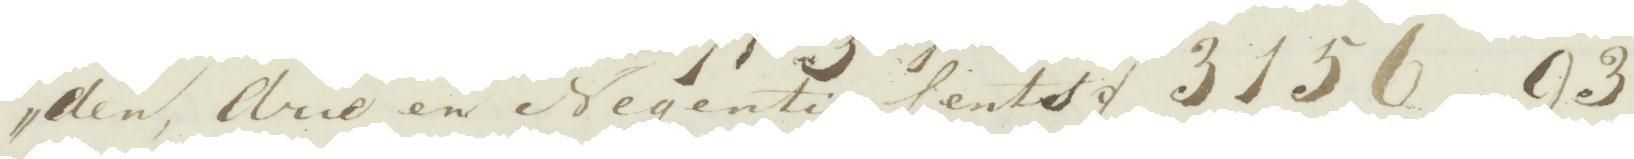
„den, drie en Negentig Cents ƒ 3156, 93
